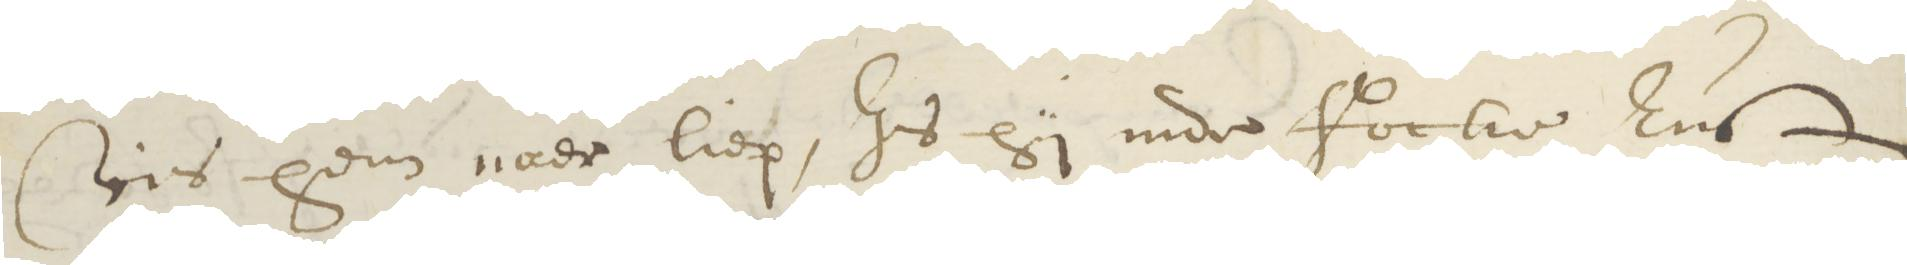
vis hem naer liep, Is hij inde focke rust
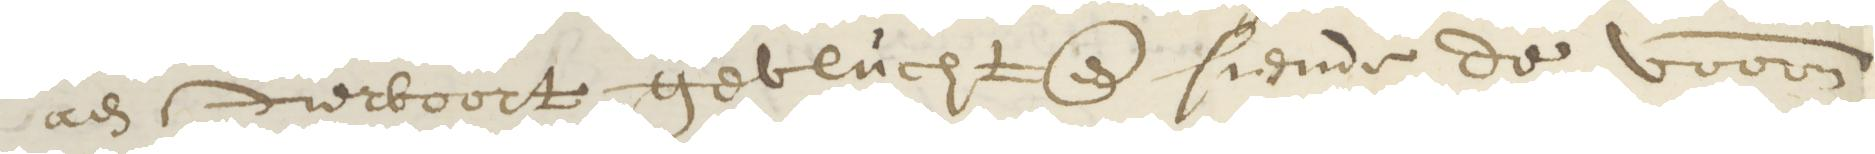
aen stierboort gevlucht ende siende de voorn
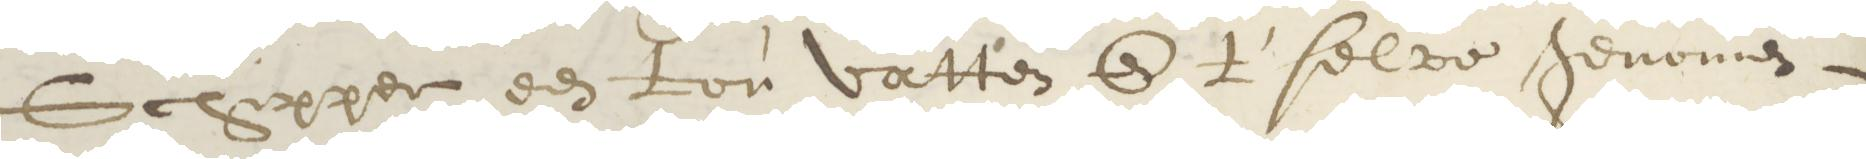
schipper een tou vatten ende t' selve genomen
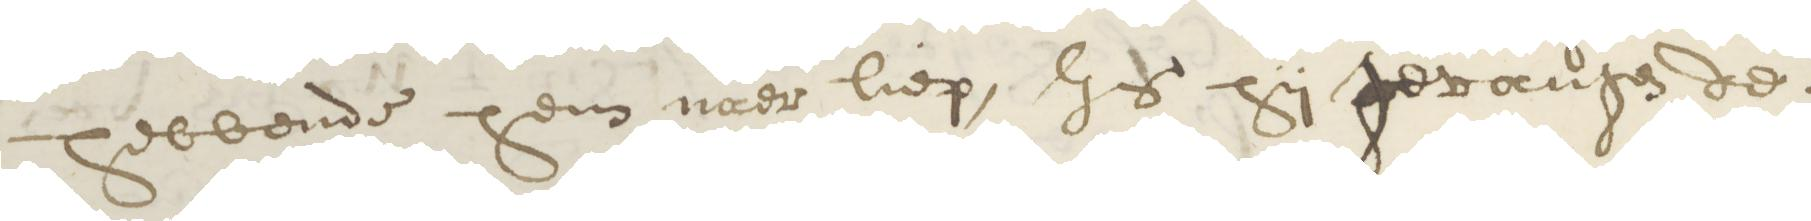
hebbende hem naer liep, Js hij gevangen de
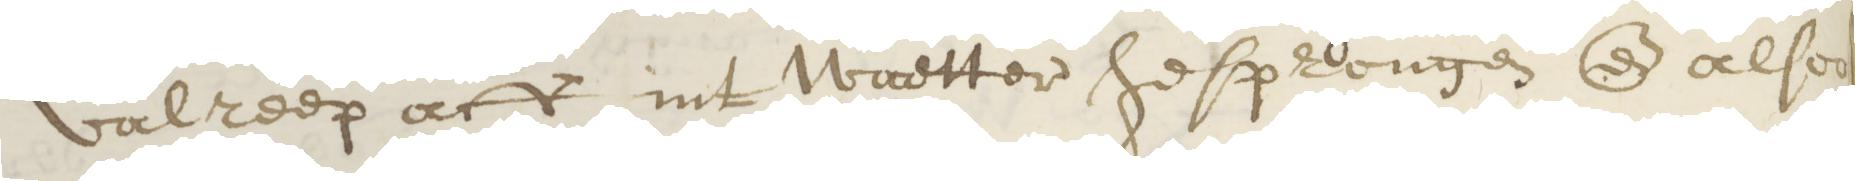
valreep aff int waetter gesprongen ende alsoo
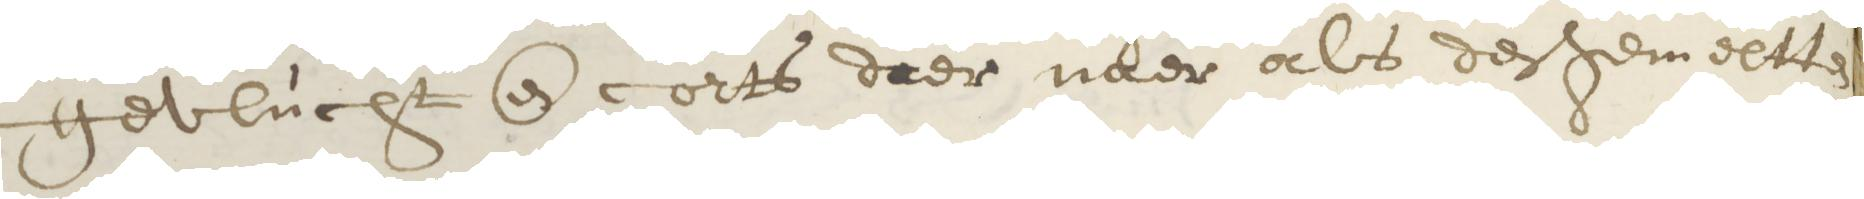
gevlucht ende corts daer naer als den gemeltten
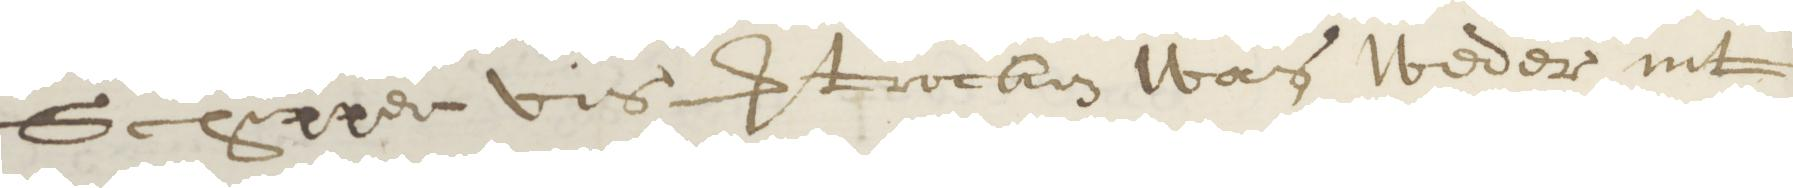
schipper vis vertrocken was weder int
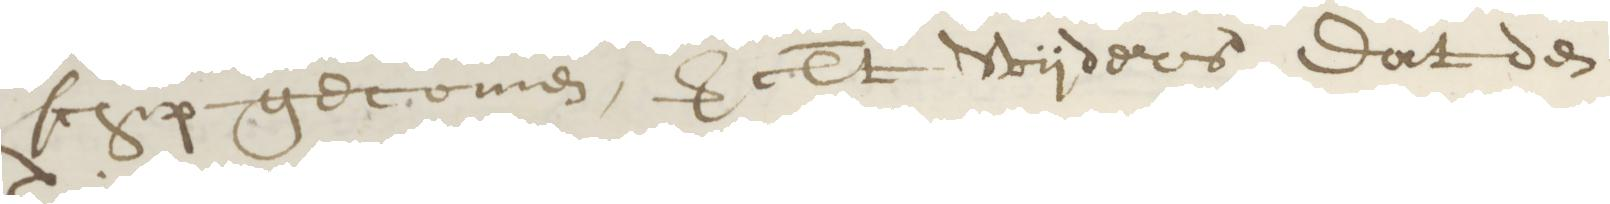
schip gecomen, verclt wijders dat den
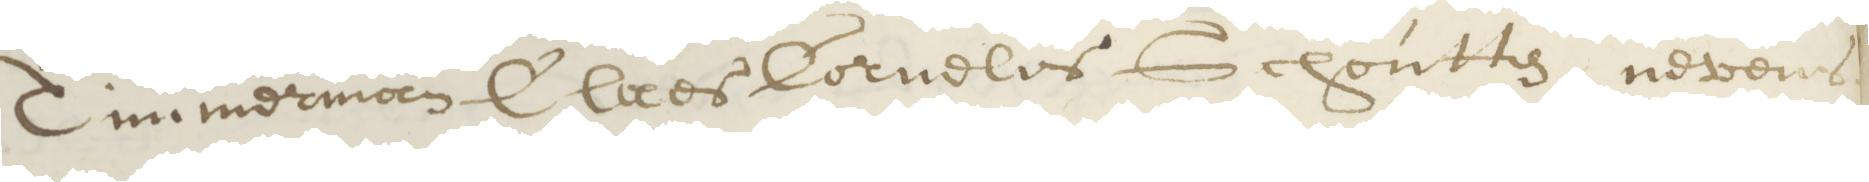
Timmerman Claes Cornelis Schoutten, nevens
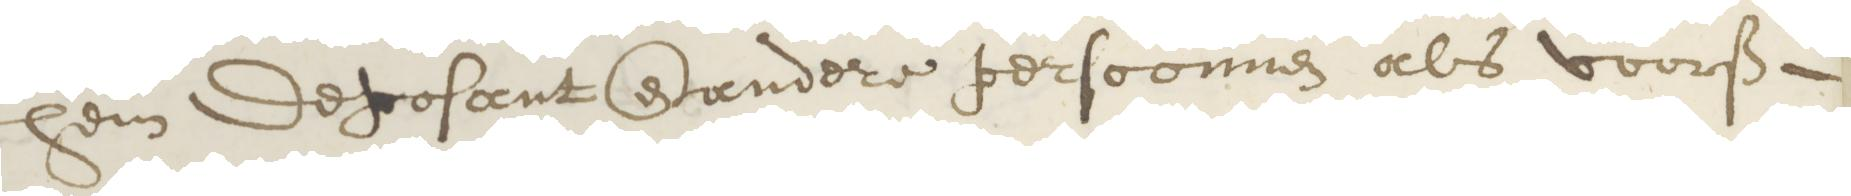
hem Deposant ende andere persoonnen als voorsz —
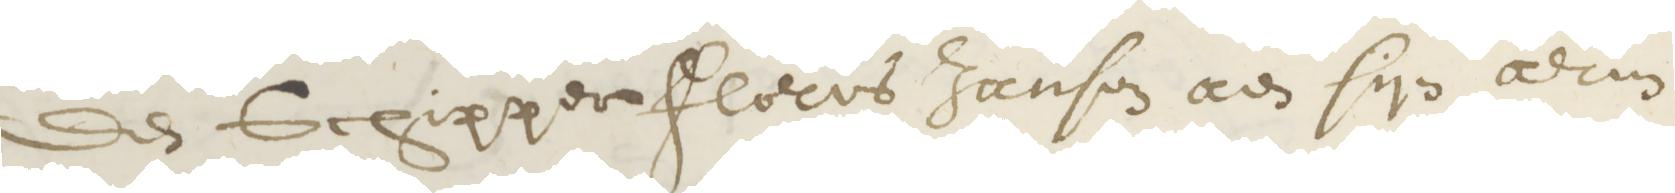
den schipper floris Jansen aen sijn arm
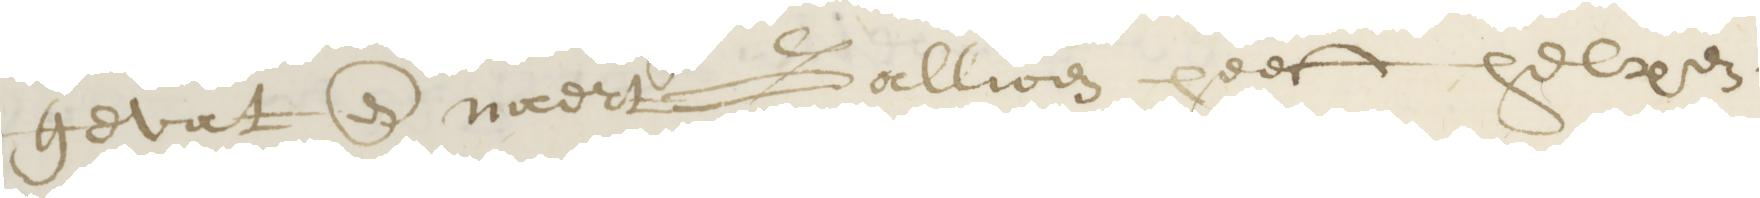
gevat ende naert Galliven heeft helpen
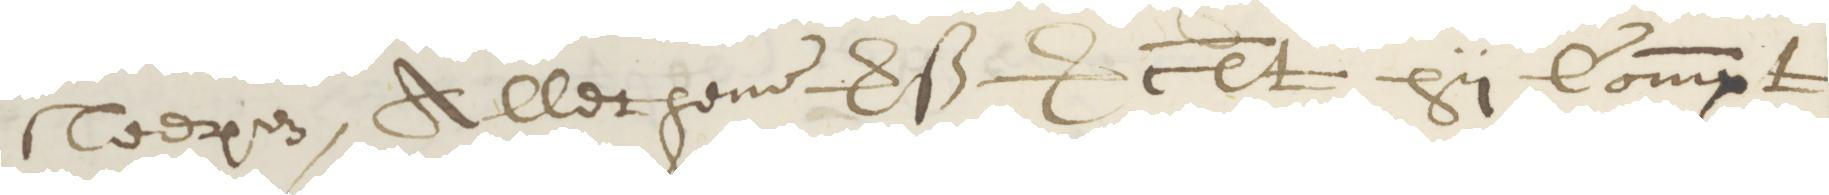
sleepen, Alletgene versz verclt hij Compt
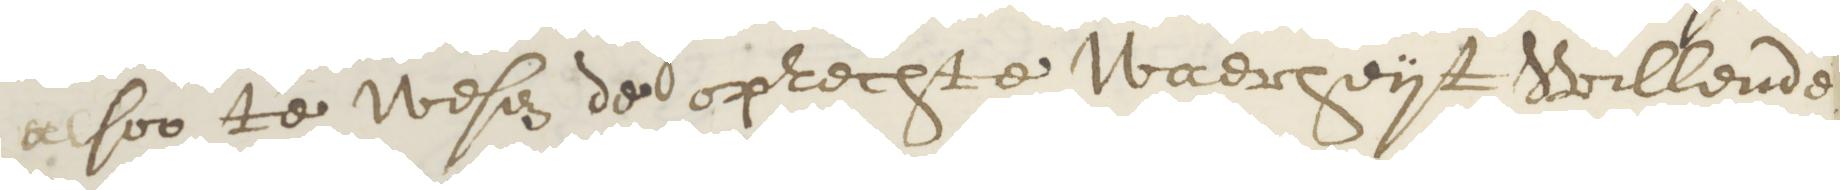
alsoo te wesen de oprechte waerheijt willende
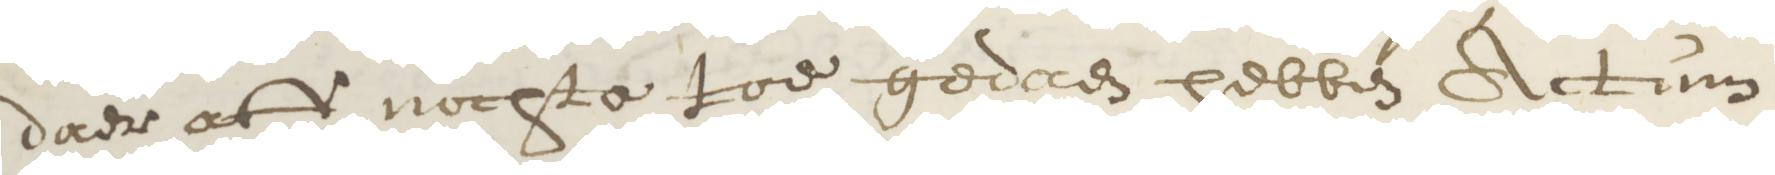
daer aff nochta toe gedaen hebben Actum
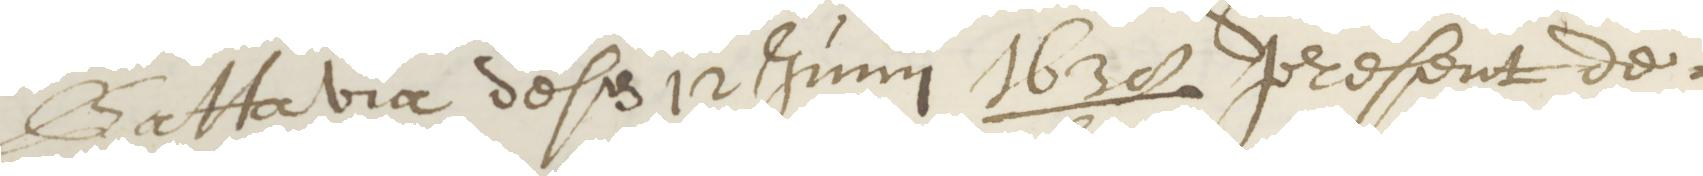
Battavia desen 12 Junij 1638 present de
